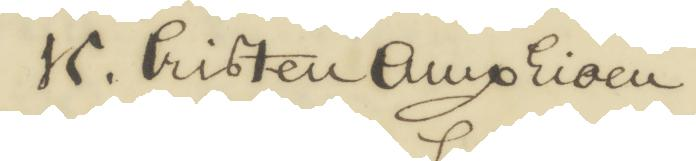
15. kisten Amphioen
